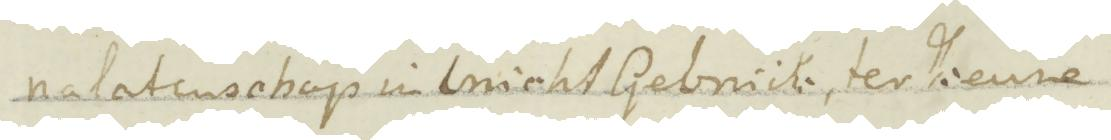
nalatenschap in Onecht Gebruik, ter keure
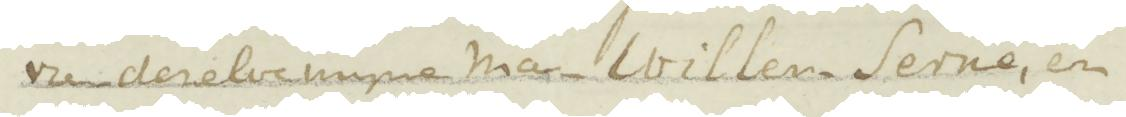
van dezelve myne man Willem Serne, en
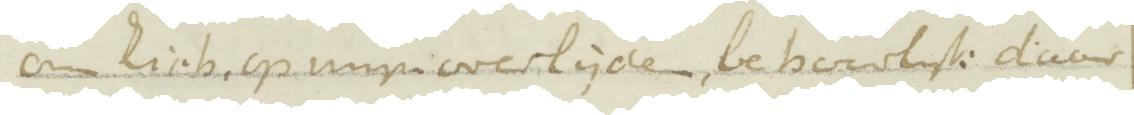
om zich, op myn overlijden, behoorlyk daar
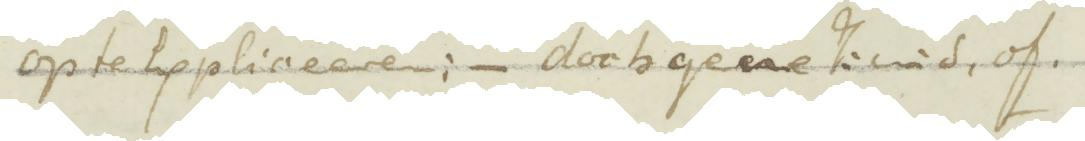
op te Expliceeren: — doch geene kind, of
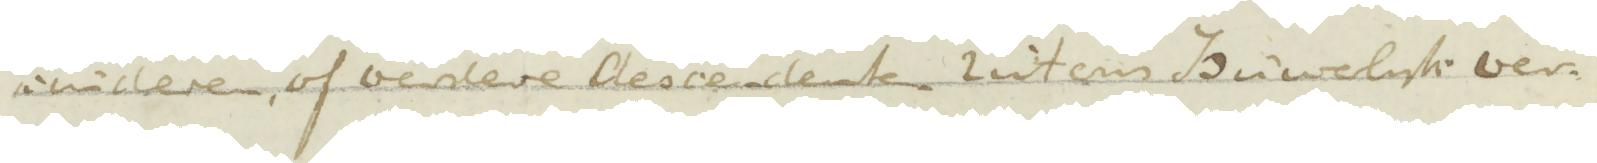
kinderen, of verdere descendenten uit ons huwelyk ver„
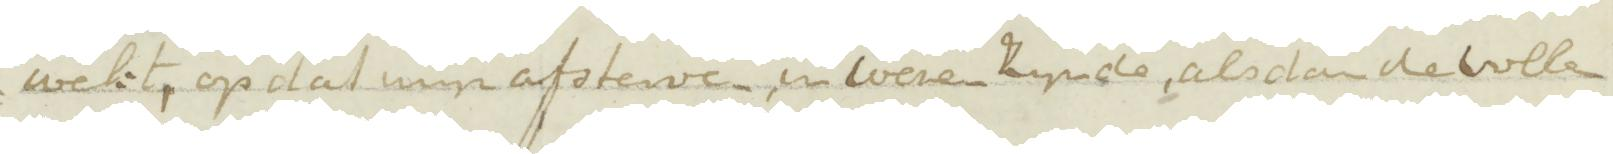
„wekt, op dat myn afsterven, in wezen zynde, als dan de vollen
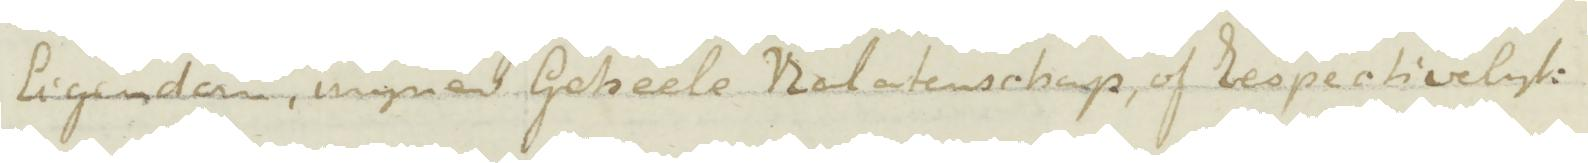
Eigendom, mijner Geheele Nalatenschap, of Respectivelyk
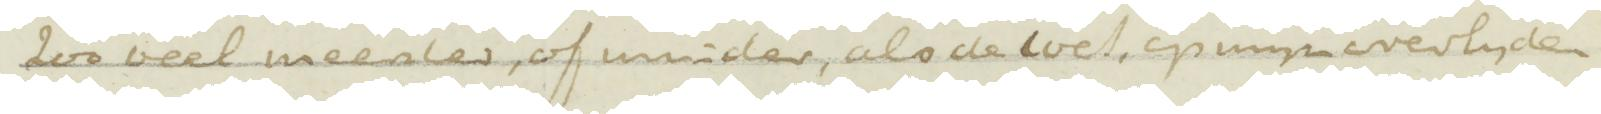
zoo veel meerder, of minder, als de wet, op myn overlyden
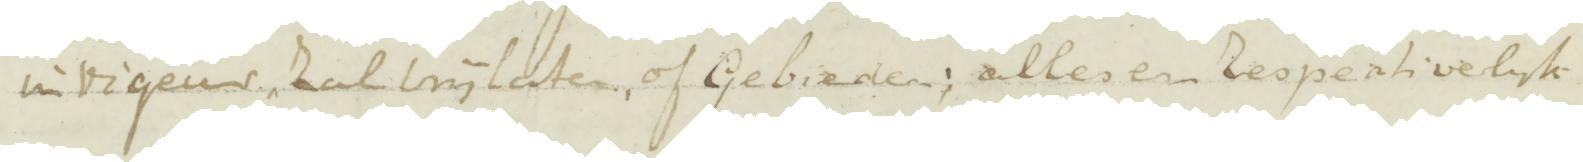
in vigeur, zal vrij laten, of Gebieden; alles en Respectivelyk
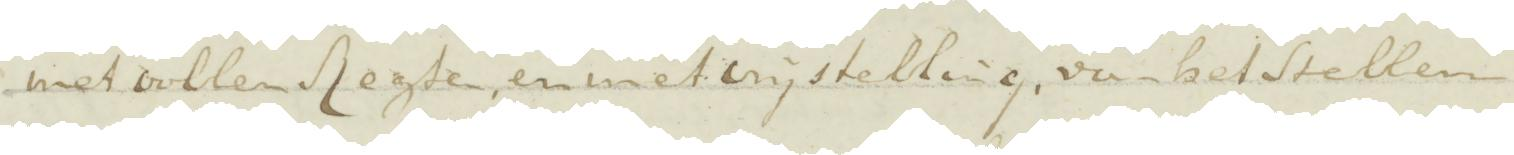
met vollen Regten, en met vrijstelling, van het stellen
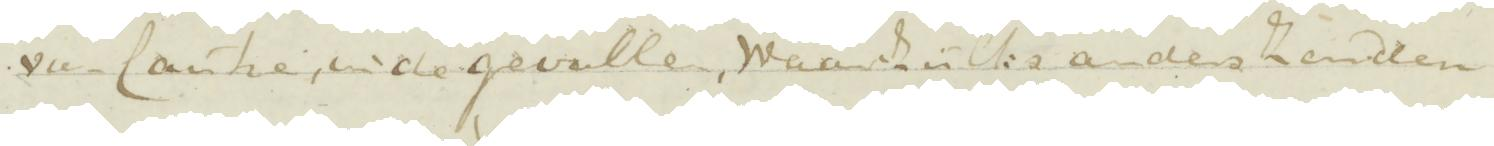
van Cautie, in de gevallen, waar zulks anders zouden
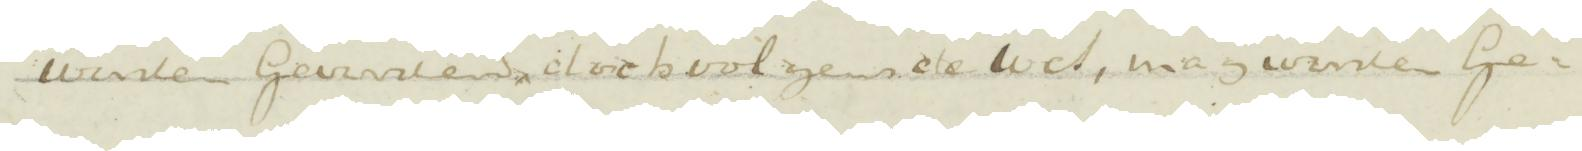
worden Gevorderd, doch volgens de wet, mag worden Ge„
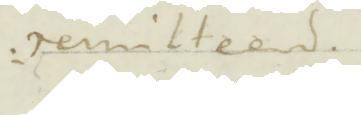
„remitteerd.
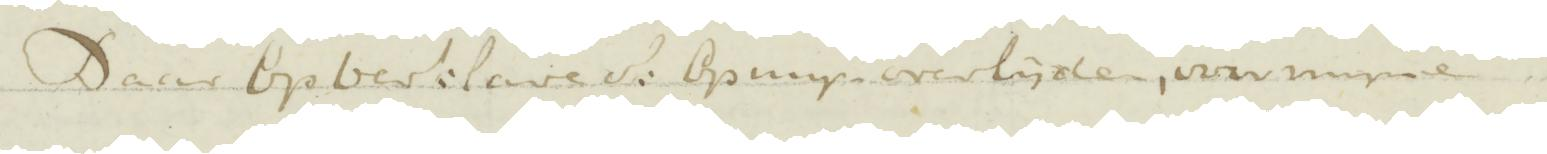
Daar Op verklare ik Op myn overlijden, voor mynen,
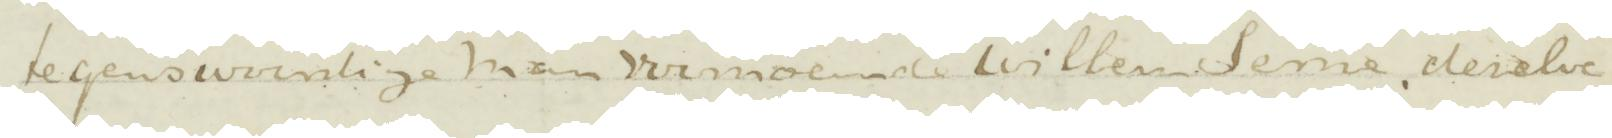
tegenswoordige man voornoemde Willem Serne, deselve
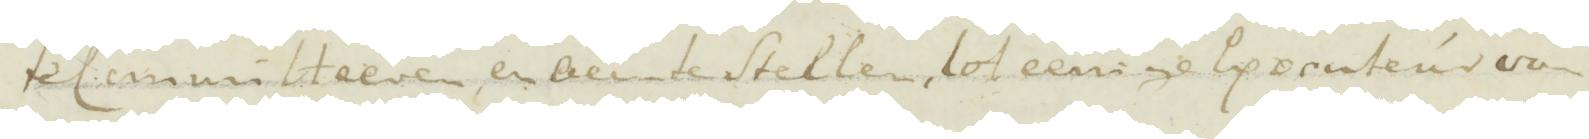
te Committeeren, en aan te stellen, tot eenige Executeur van
